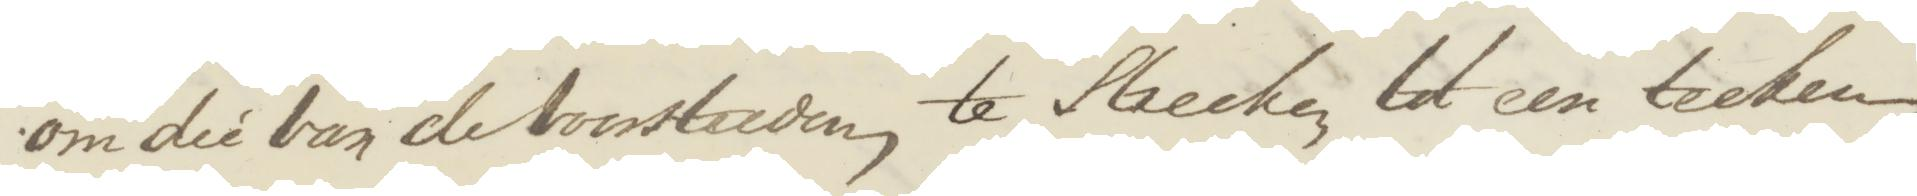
om die van de voortsteeden te strecken tot een teeken
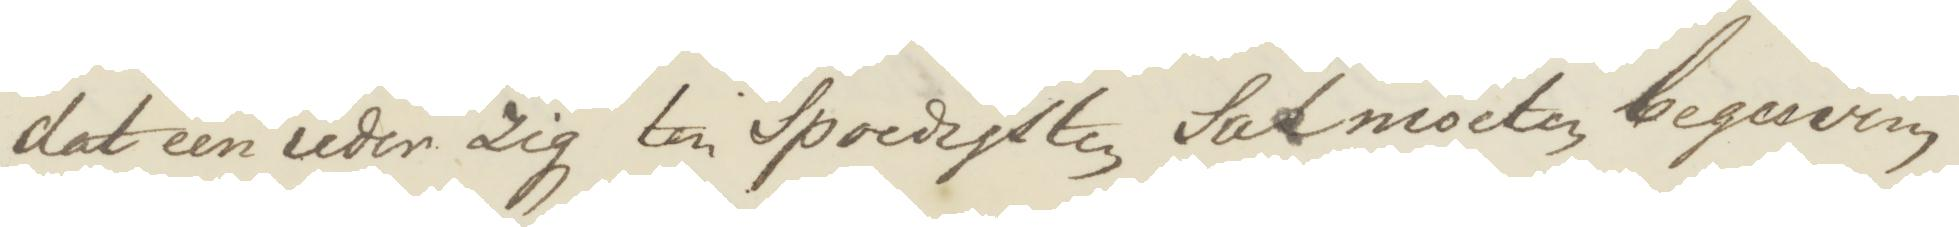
dat een ieder zig ten spoedigsten sal moeten begeeven
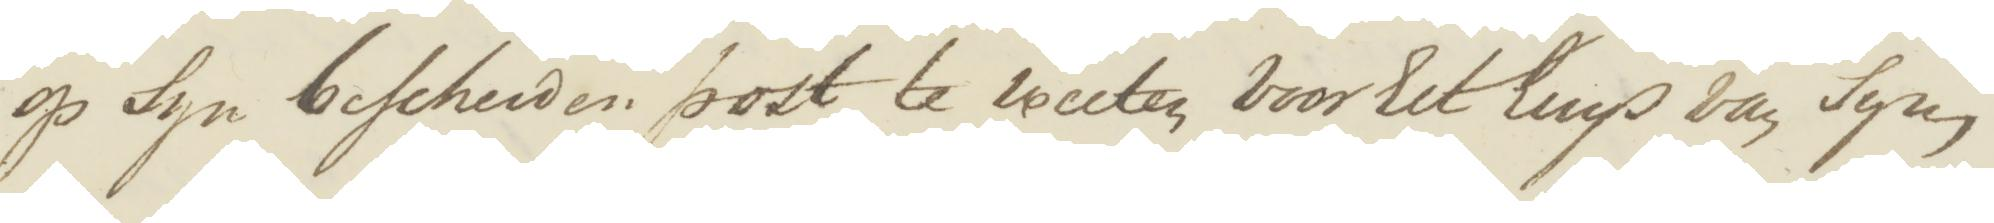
op syn bescheiden post te weeten voor het huys van syn
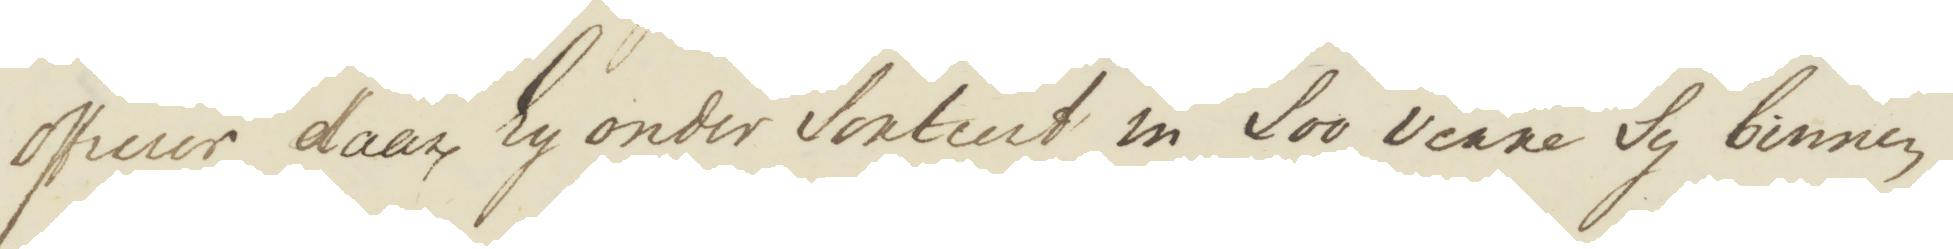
officier daar hy onder sorteert in soo verre sy binnen
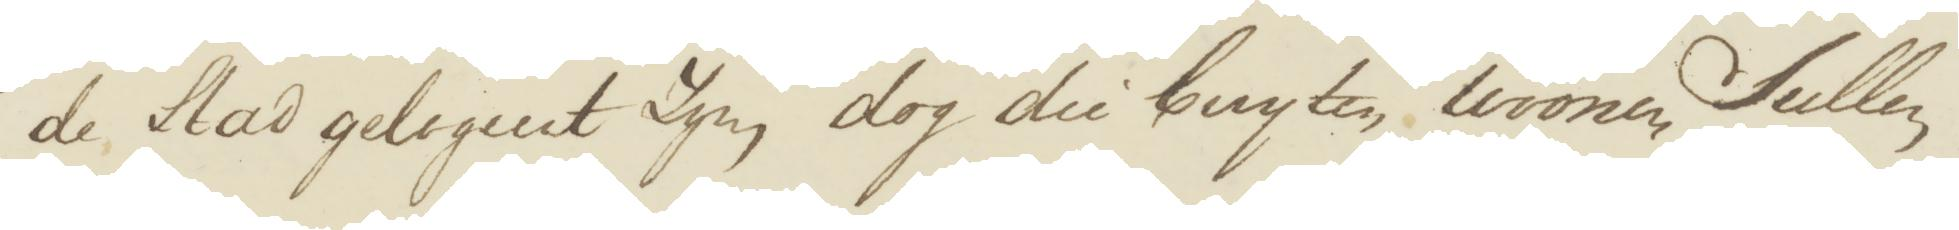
de stad gelegeert zyn dog die buyten woonen sullen
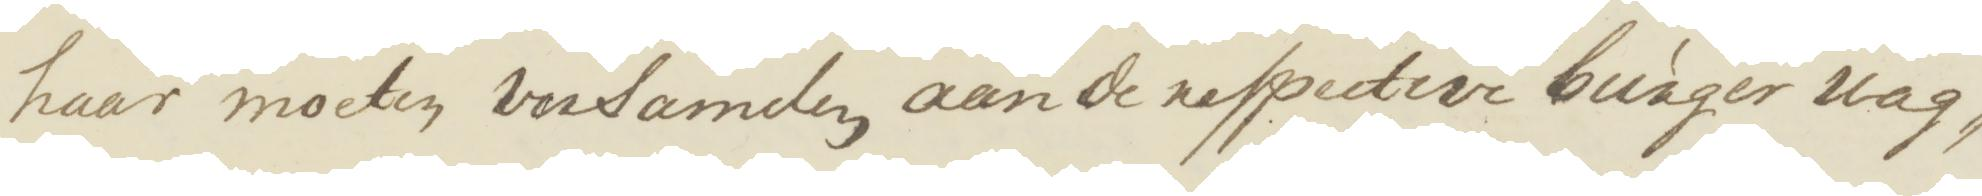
haar moeten versamelen aan de respective burger wag„
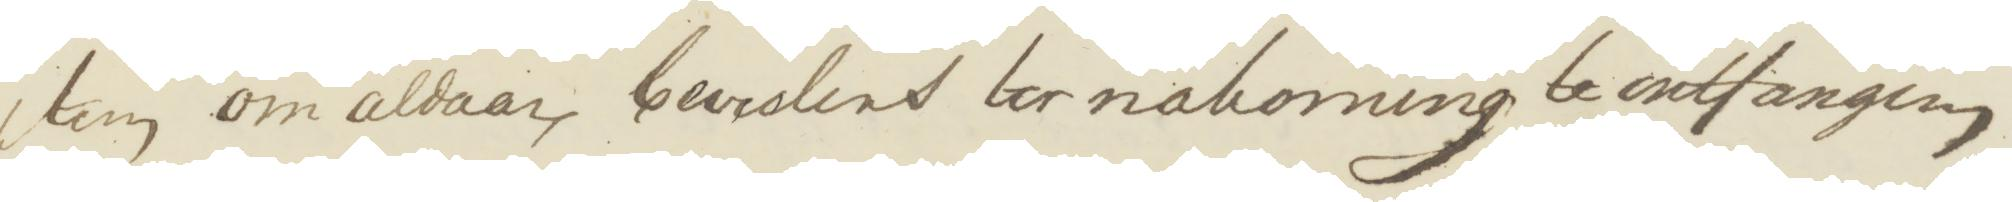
„ten om aldaar beveelens ter nakoming te ontfangen
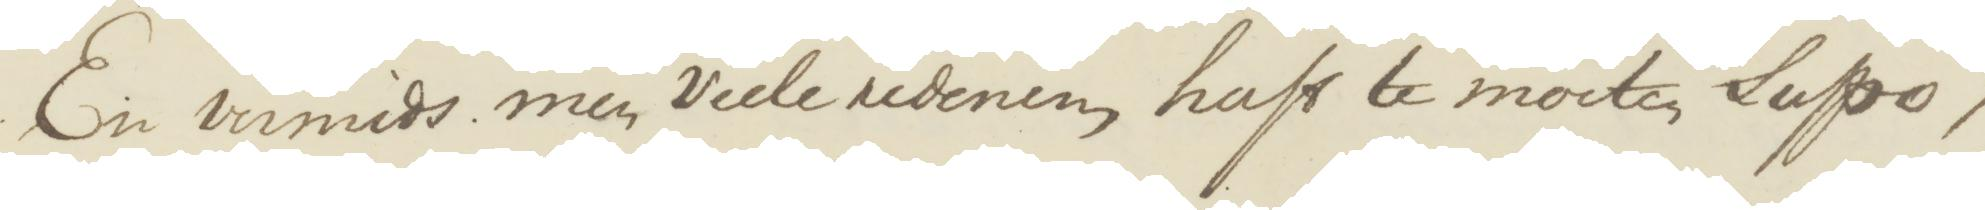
En vermids men veele redenen haft te moeten suppo,
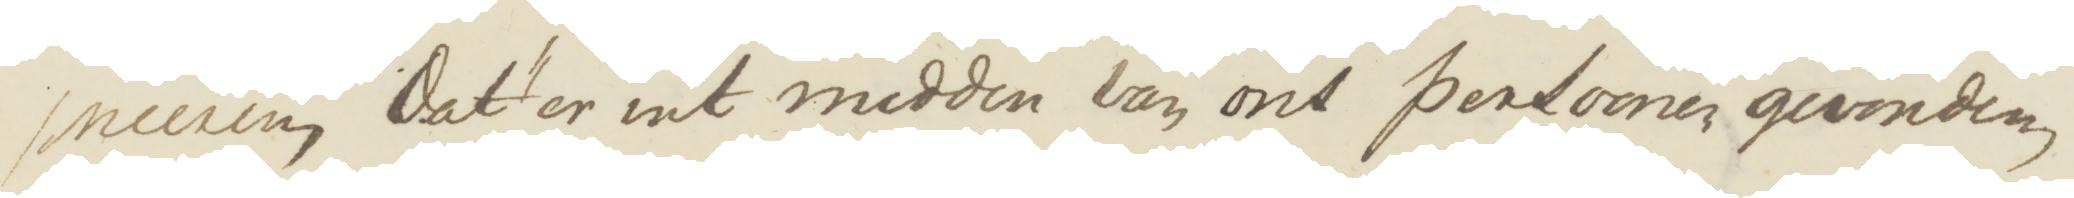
,neeren dat''er in't midden van ons persoonen gevonden
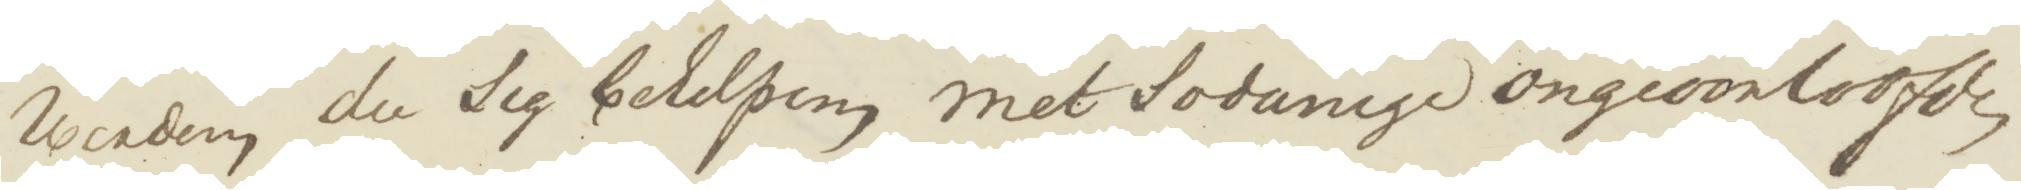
werden die sig behelpen met sodanige ongeoorloofde
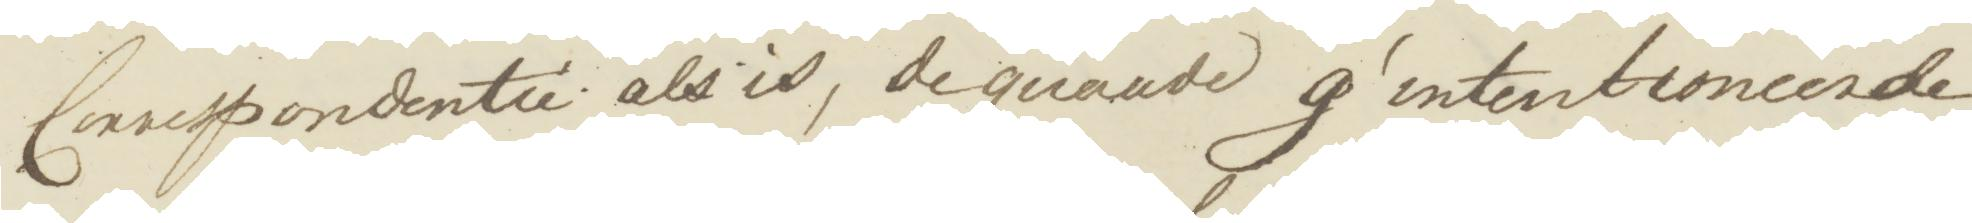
Correspondentie als is, de quaade g’intentioneerde
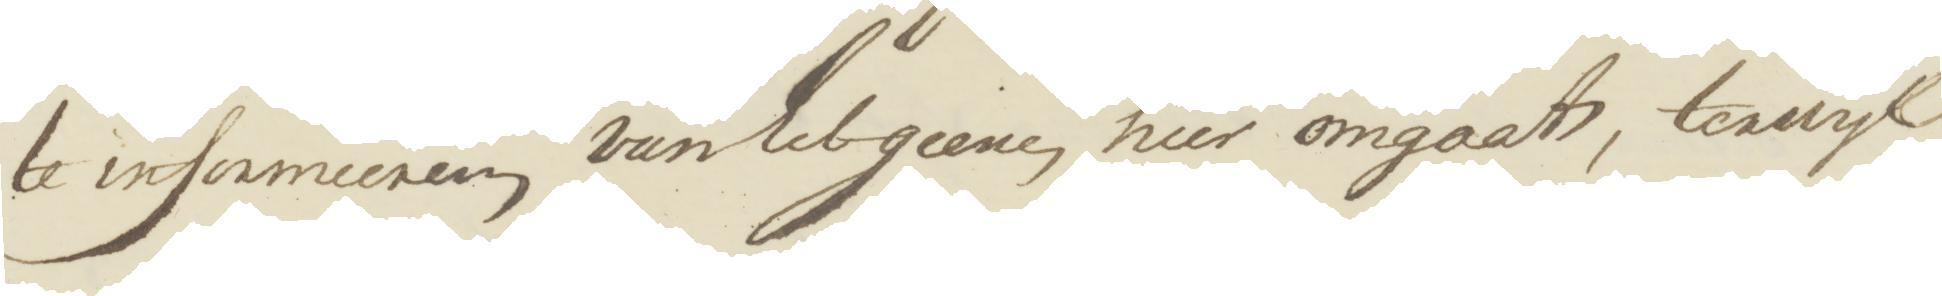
te informeeren van het geene hier omgaat, terwijl
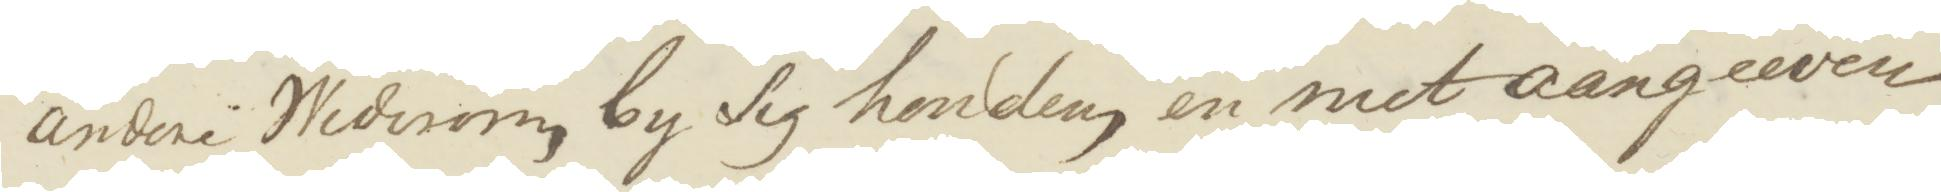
andere wederom by sig houden en met aangeeven
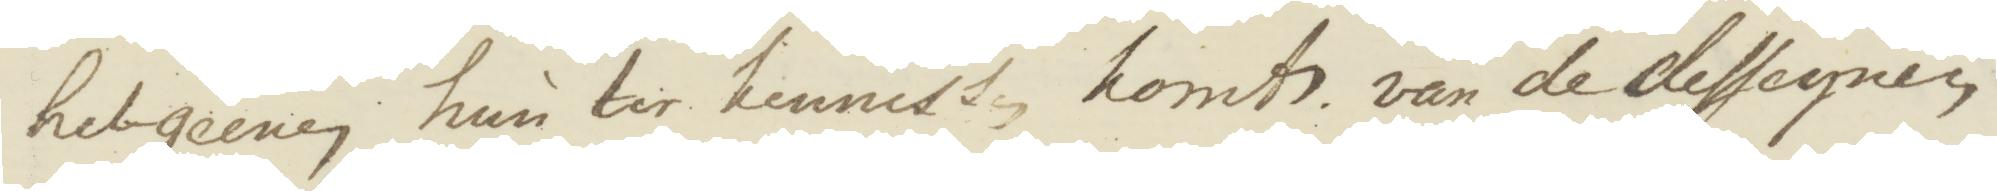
hetgeene hun ter kennissen komt van de desseynen
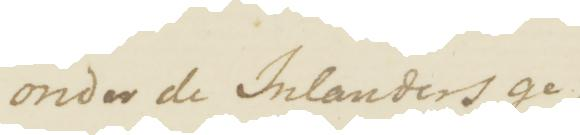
onder de Inlanders ge„
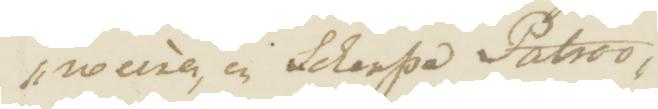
„weiren, en scheepe Patroo„
